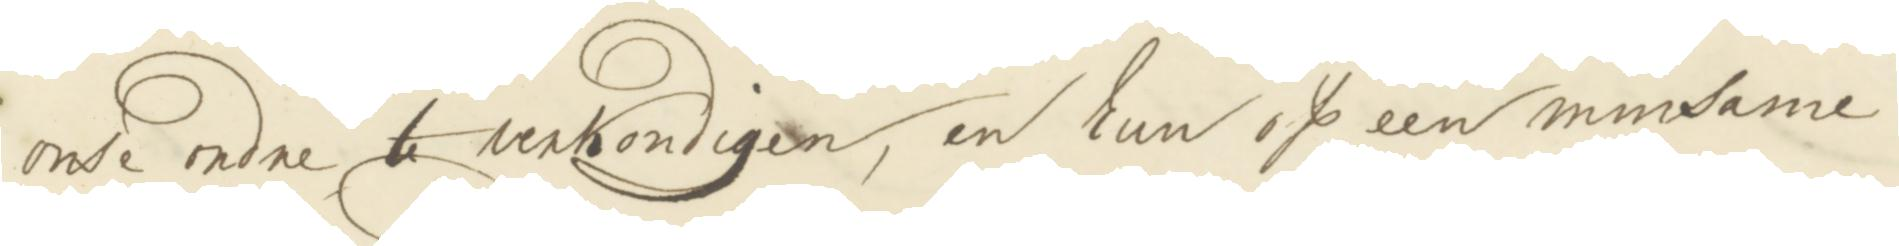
onse ordre te verkondigen, en hun op een minsame
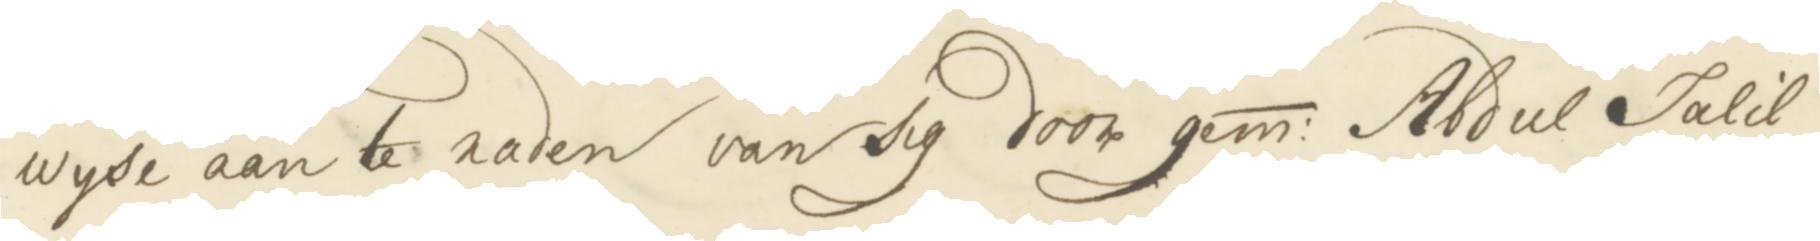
wyse aan te raden van sig door gem: Abdul salil
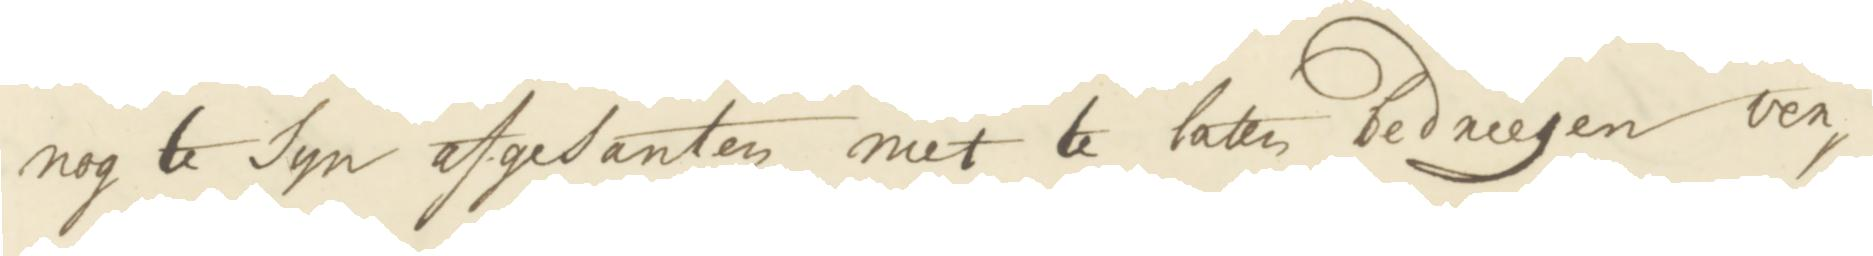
nog te syn afgesanten niet te laten bedriegen ver„
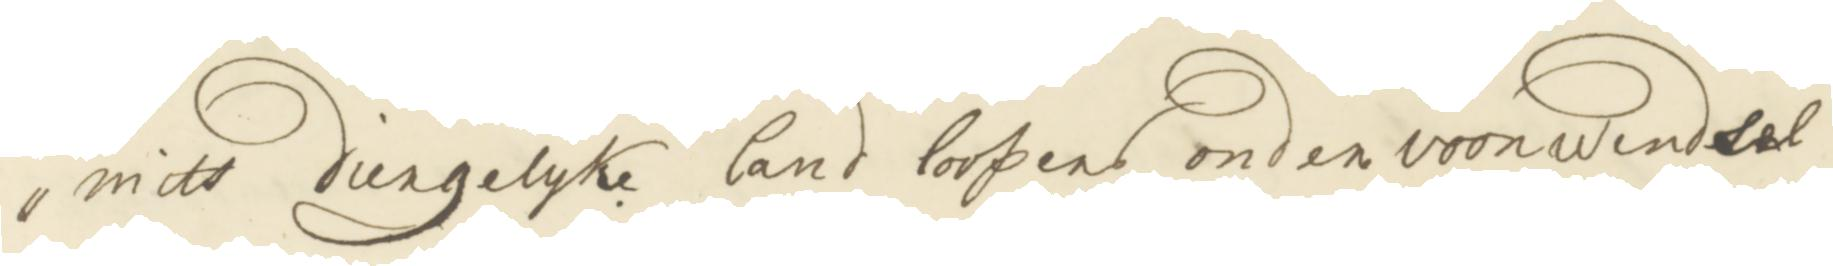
„mits diergelijke land loopers onder voorwendsel
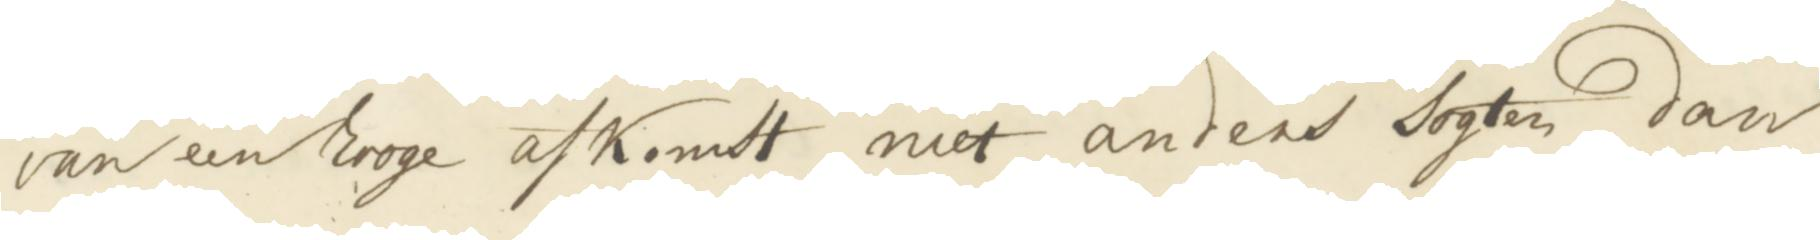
van een hooge afkomst niet anders sogten dan
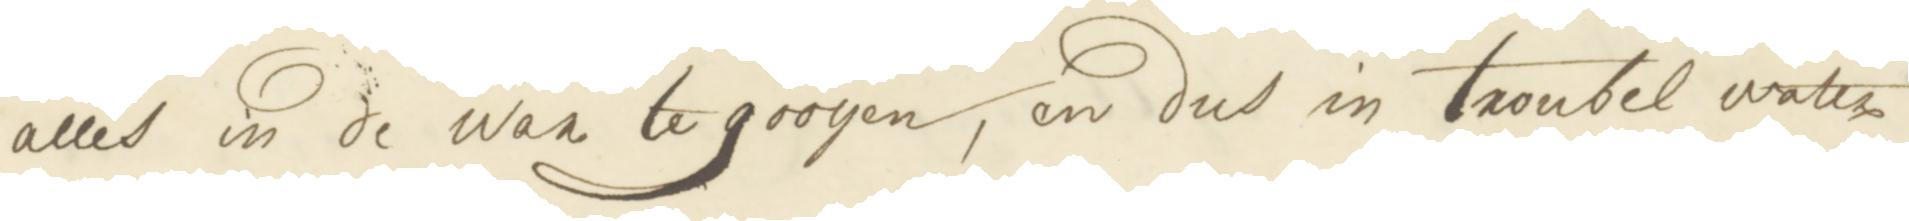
alles in de war te gooijen, en dus in troubel water
